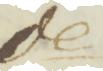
d:e
